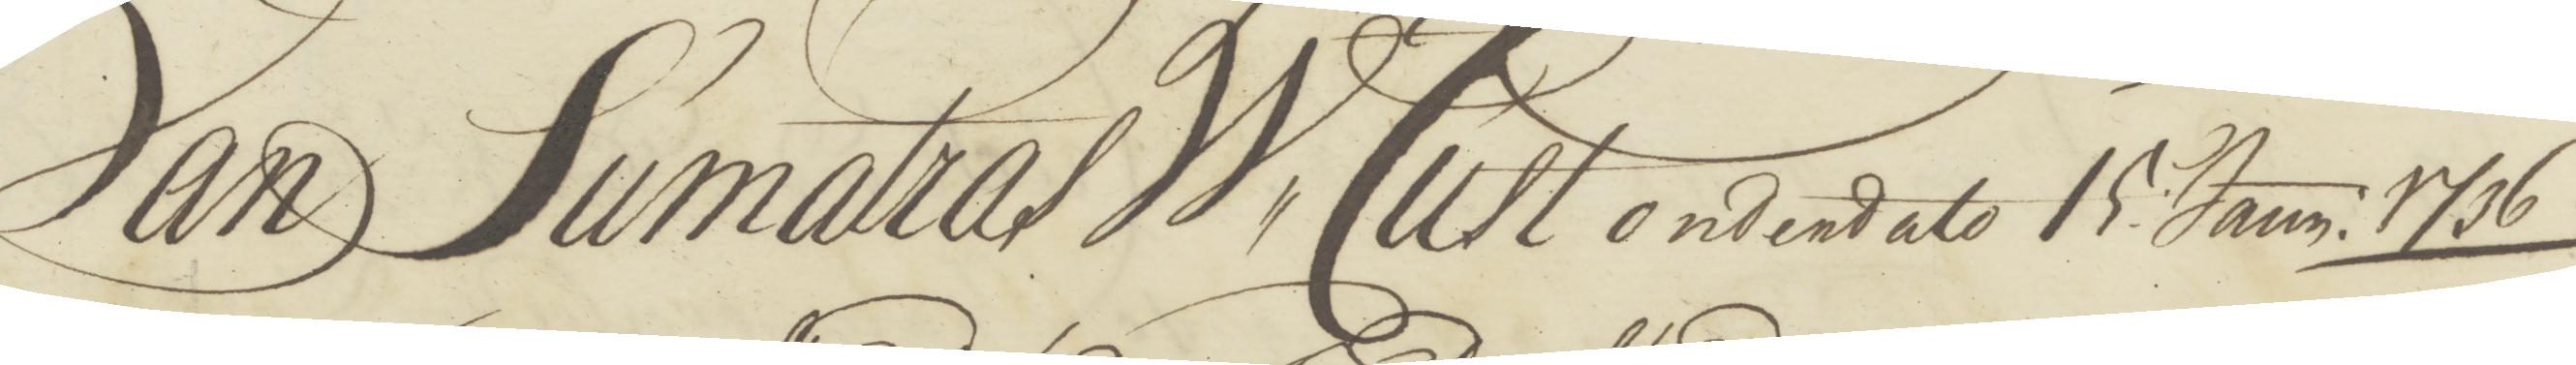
Van Sumatras W„t Cust onderdato 15: Jani: 1736.
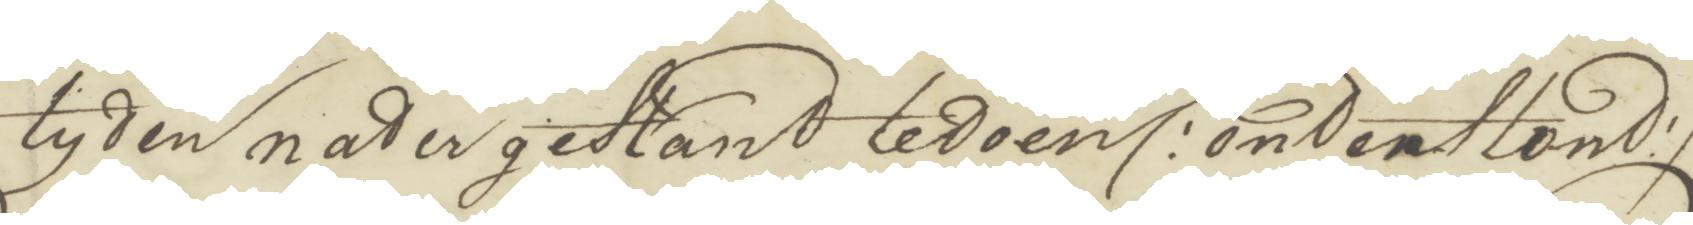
tijden nader gestand te doen (:onderstond:)
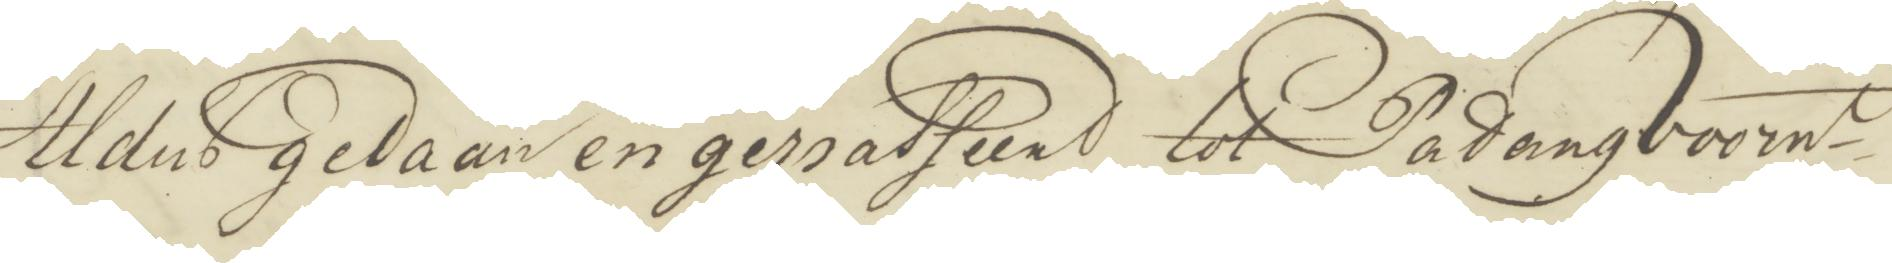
Aldus gedaan en gepasseerd tot Padang voorn=t
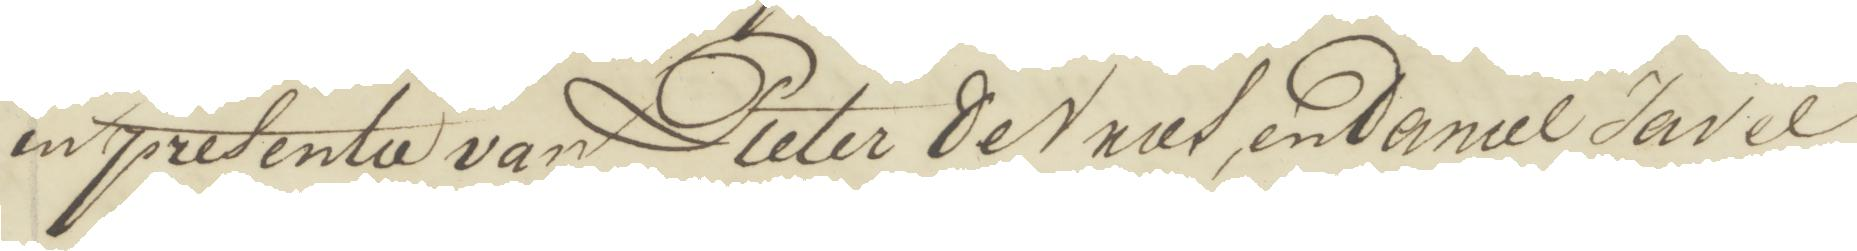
in presentie van Pieter de Vries, en Daniel Iavel
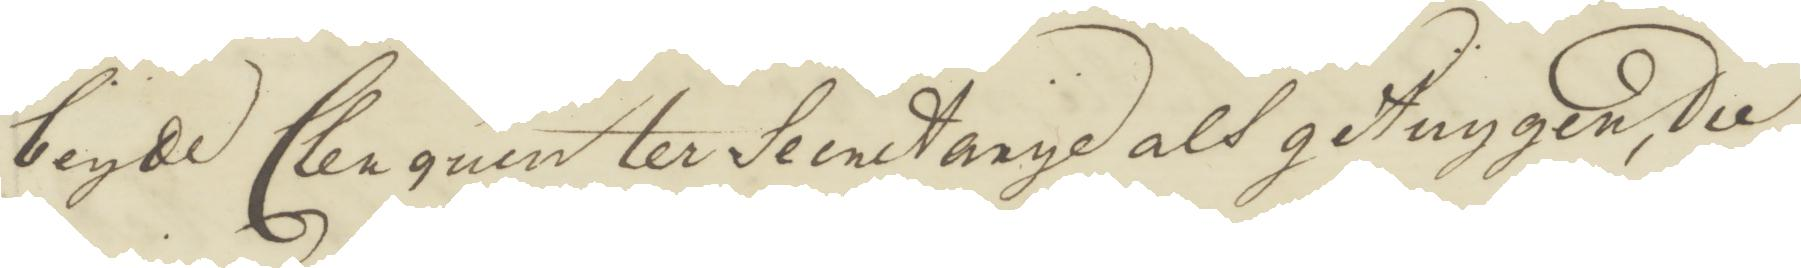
beijde Clerquen ter secretarije als getuygen, Die
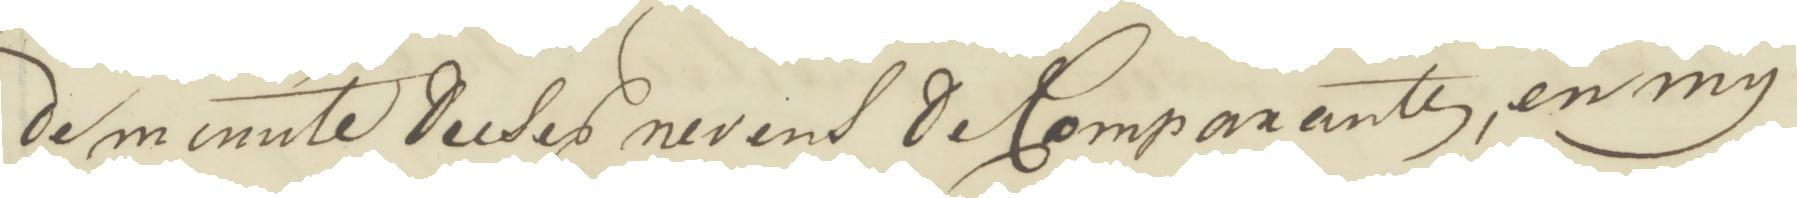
de minute deeses nevens de Comparanten, en mij
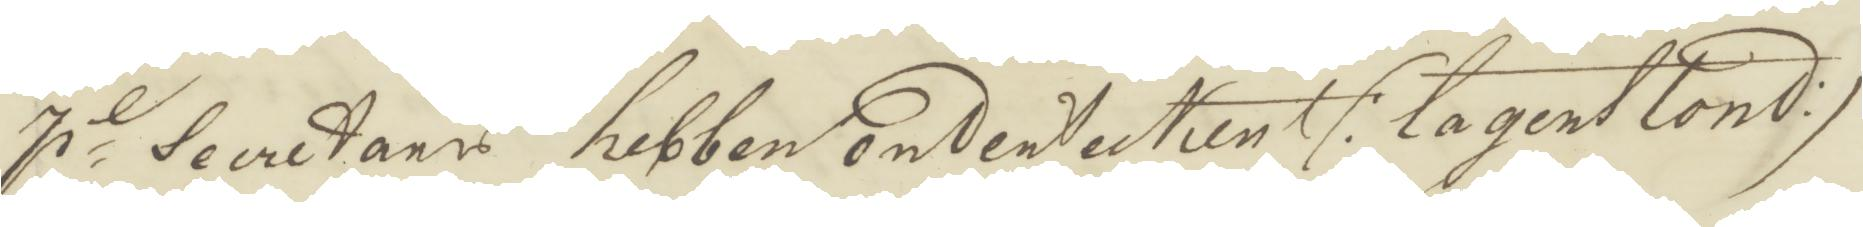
p=l secretaris hebben onderteckent (:lagerstond:)
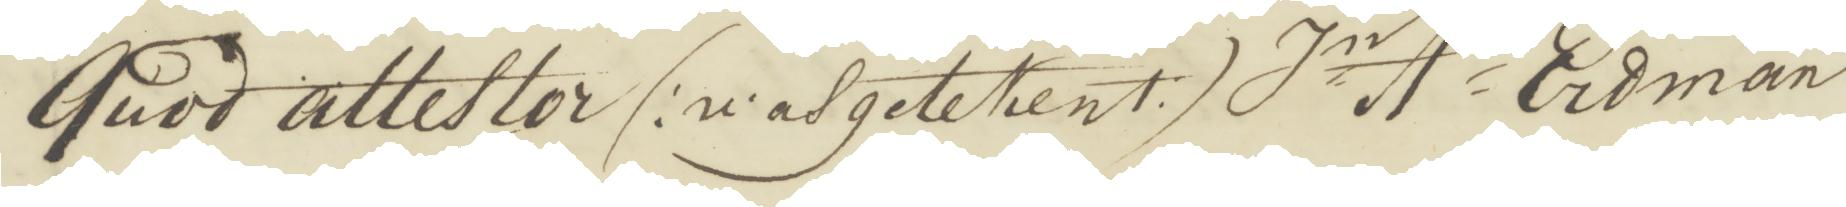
Quod attestor (:was getekent:) I=n A=m Erdman
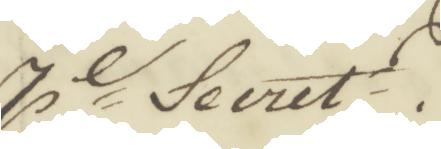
p=l secret=s.
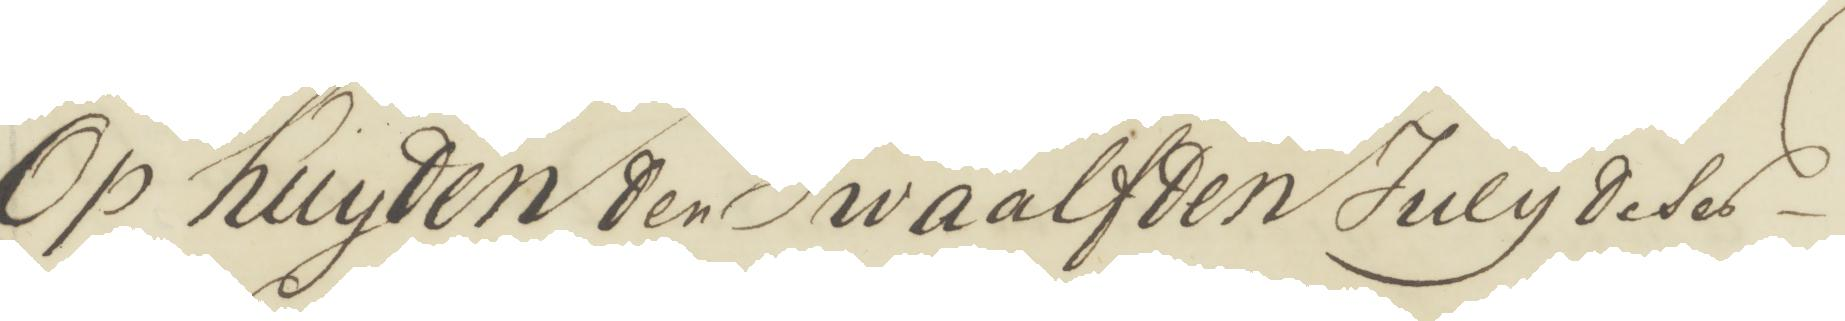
Op huijden den Twaalf den Julij deses _
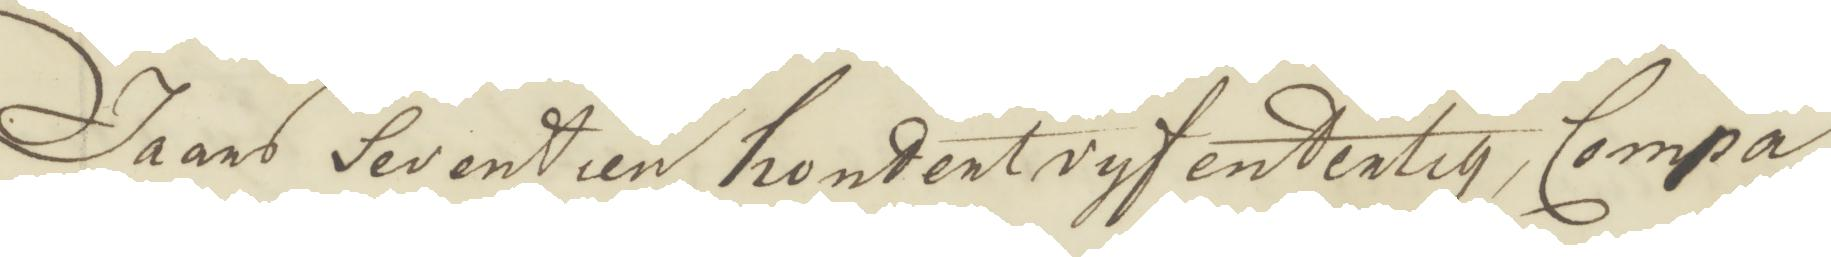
Iaars seventien hondert vijfendertig, Compa
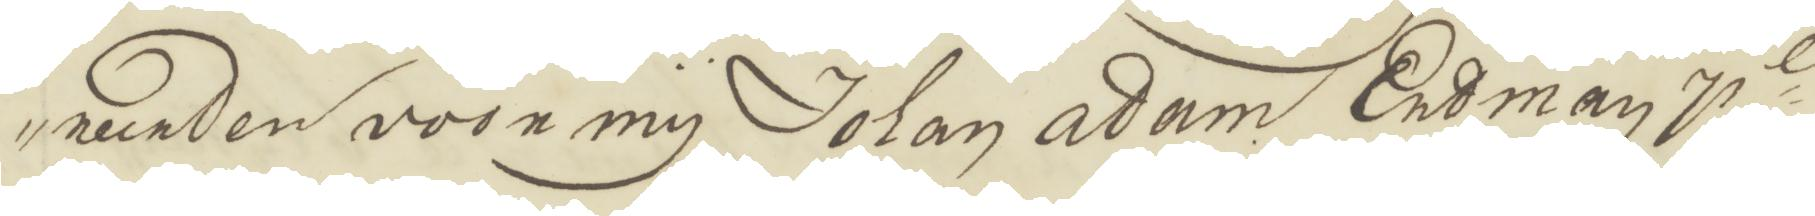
reerden voor mij Iohan adam Erdman p=l
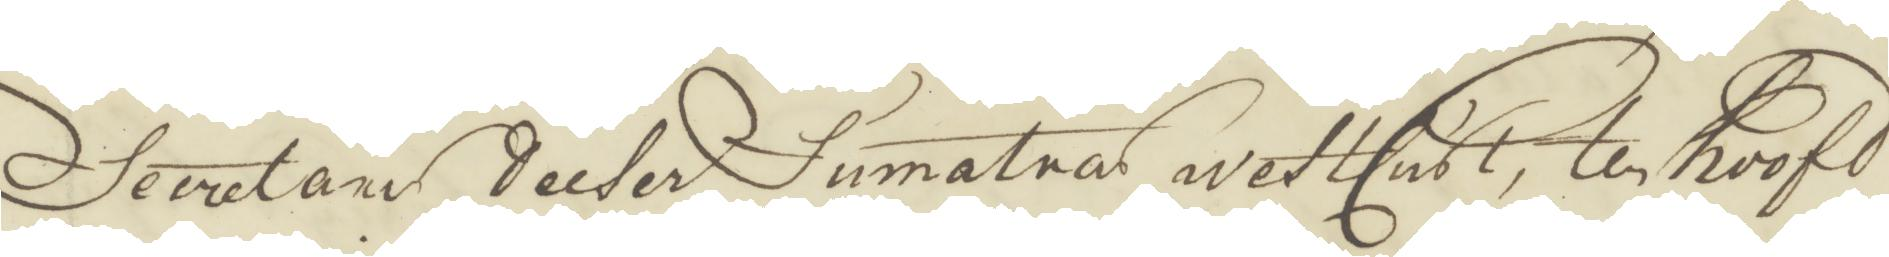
Secretaris deeser Sumatras westcust, ter hoofd
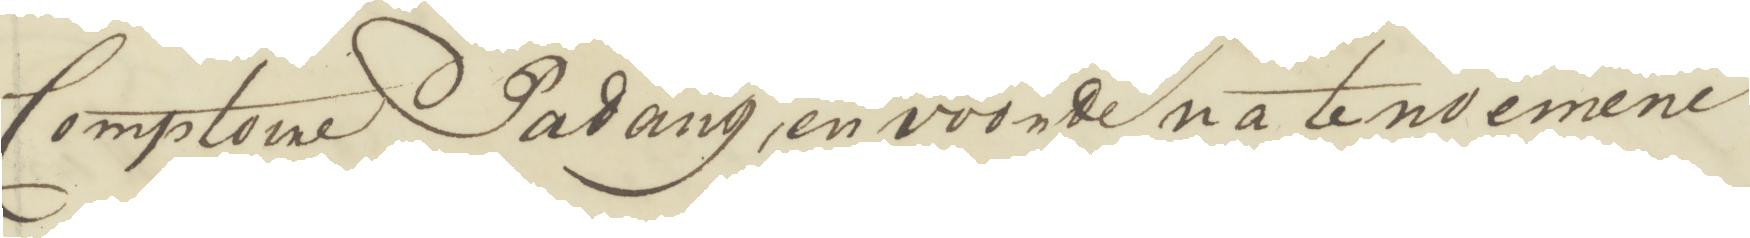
Comptoire Padang, en voorde na tenoemene
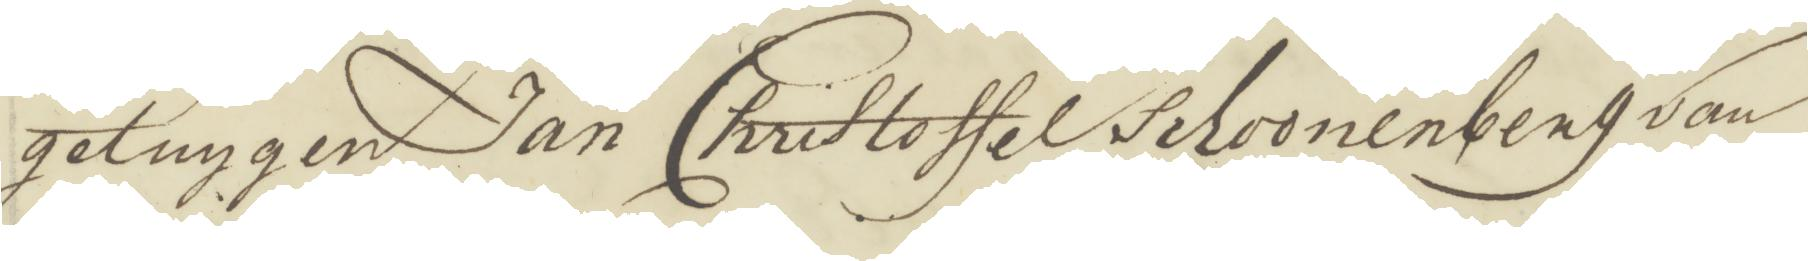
getuygen Ian Christoffel schoonenberg van
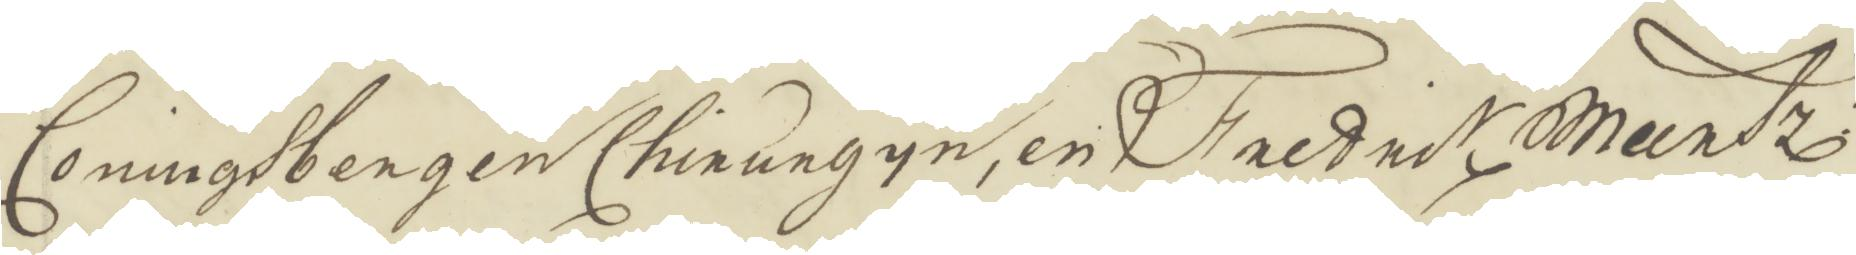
Coningsbergen Chirurgijn, en Fredrik Meersz:
